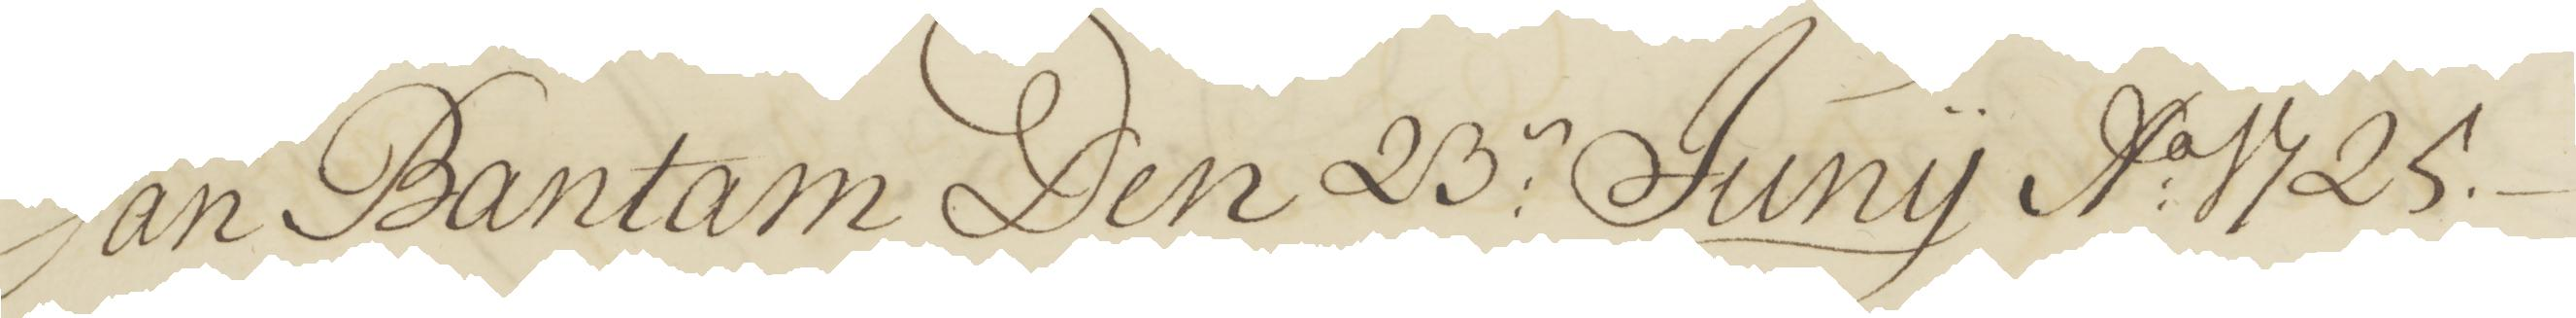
Van Bantam Den 23:' Junij A:o 1725. —
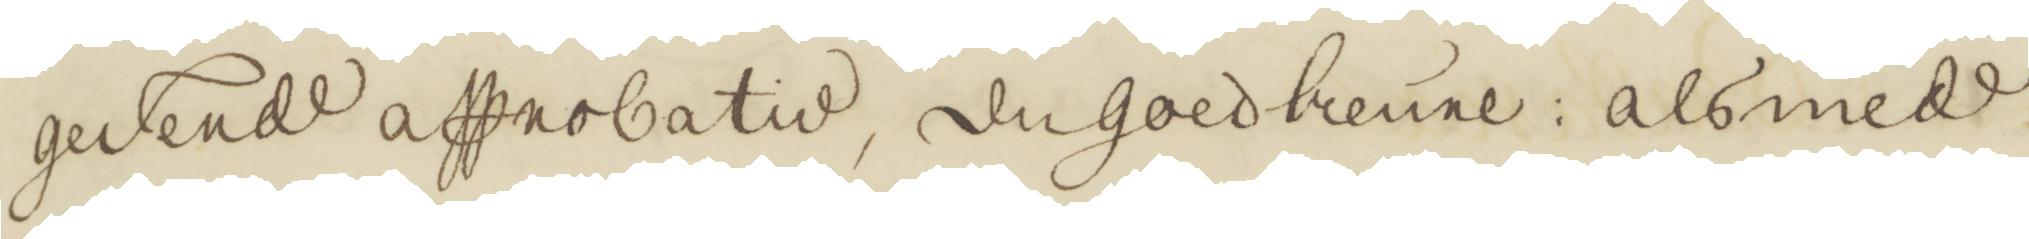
geEerde approbatie, en goedkeure: als mede
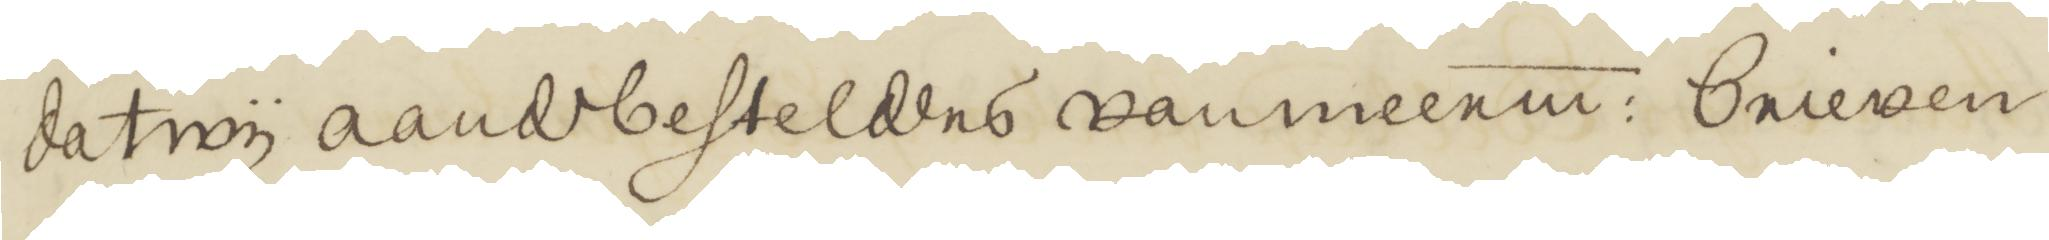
dat wij aan de bestelders van meerm: brieven
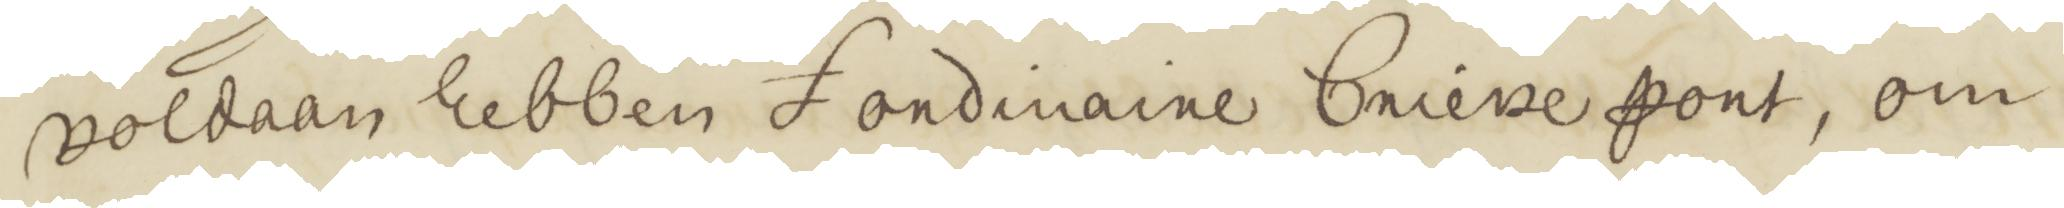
voldaan hebben ’t ordinaire brieve port, om
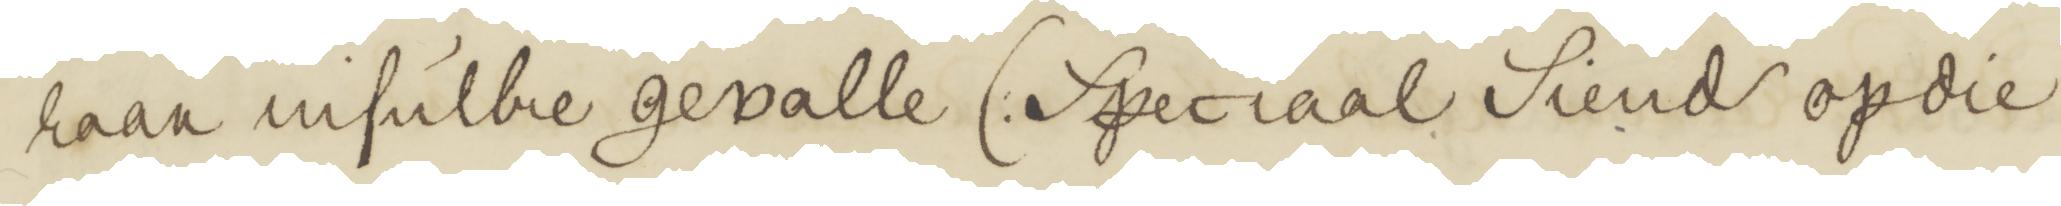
haar insulke gevalle (:speciaal siende op die
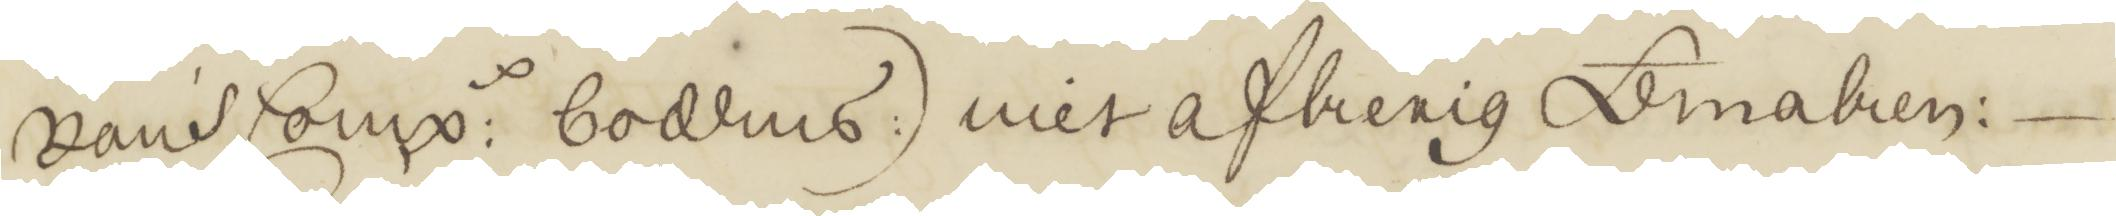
van’s Comp:s bodems:) niet afkerig te maken: —
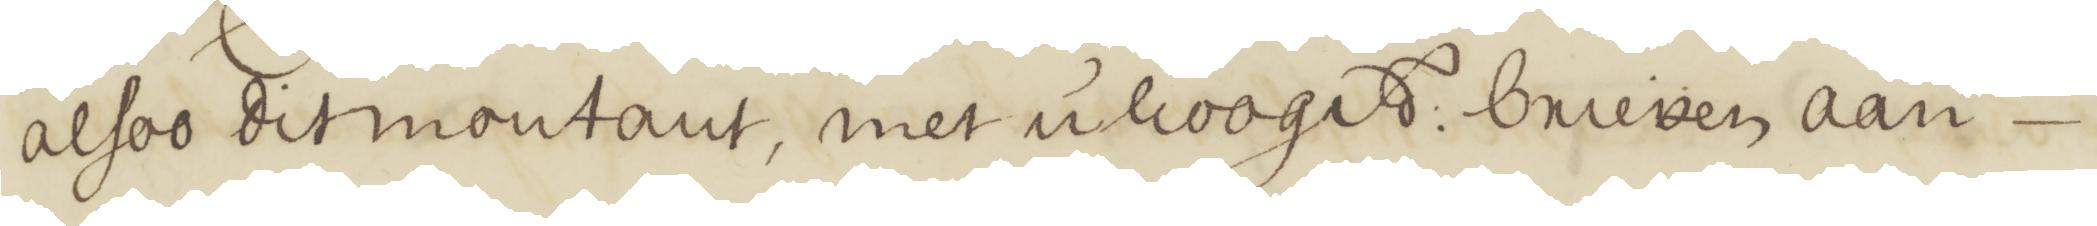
alsoo dit montant, met u hoog Ed: brieven aan —
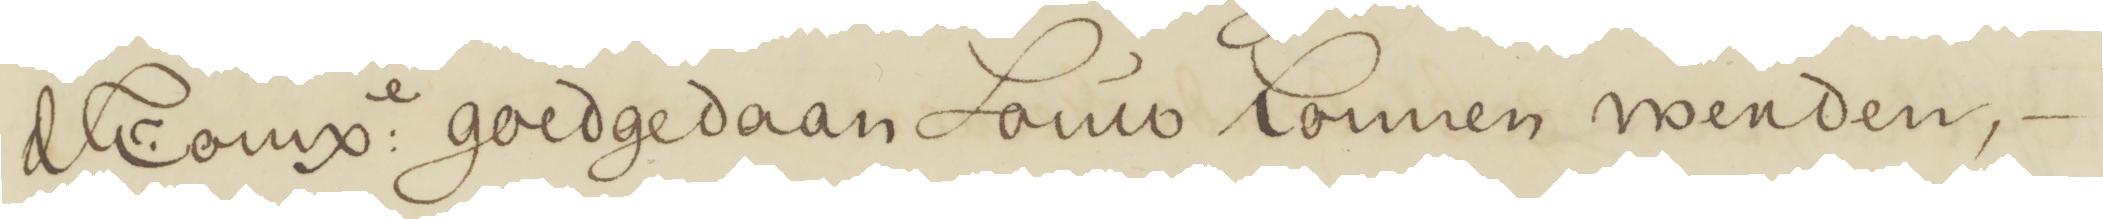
dEComp:e goedgedaan souw konnen werden, —
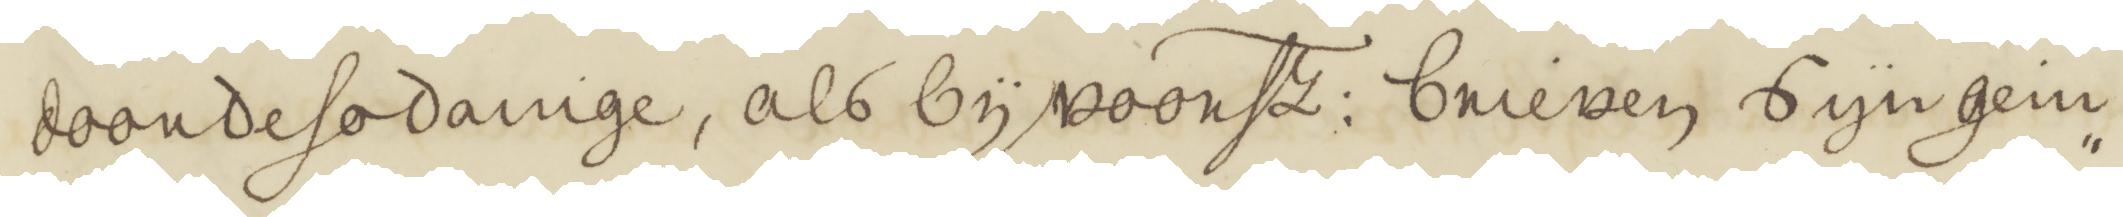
door de sodanige, als bij voorsz: brieven sijn gein„
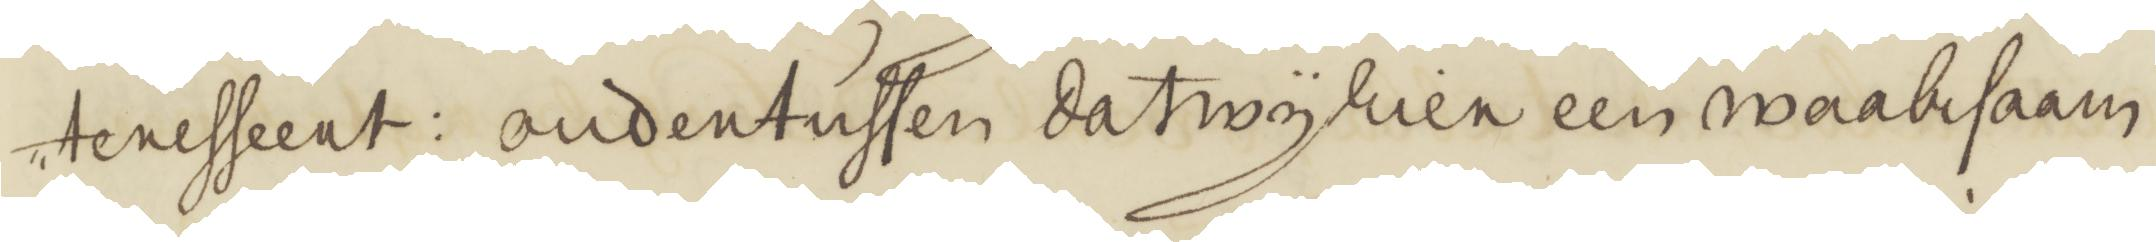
„teresseert: ondertussen dat wij hier een waaksaam
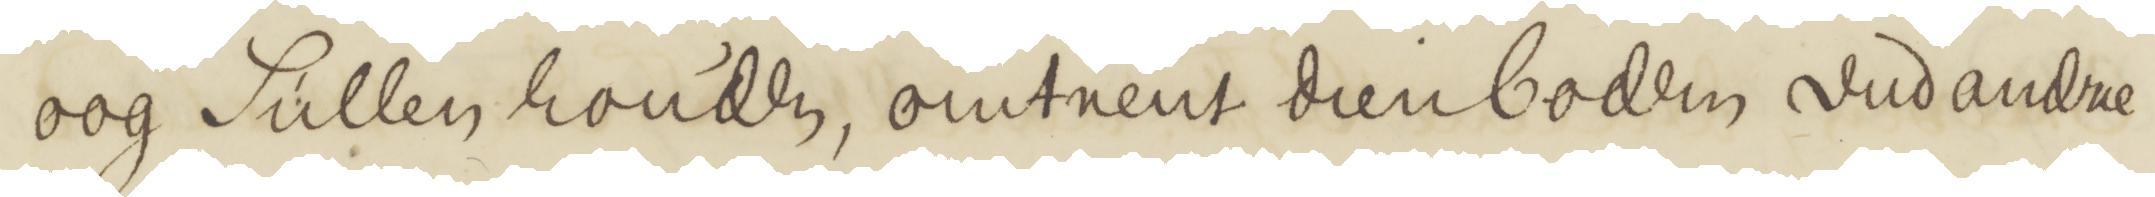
oog sullen houden, omtrent dien bodem end'andre
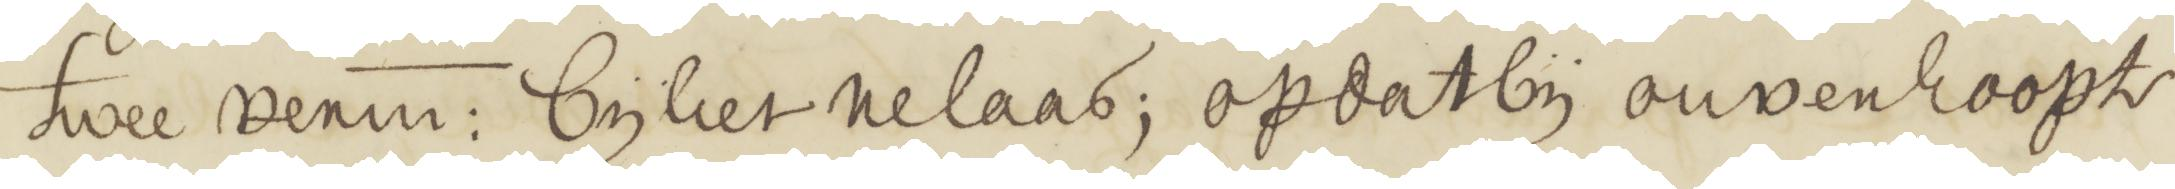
twee verm: bij het relaas; opdat bij onverhoopte
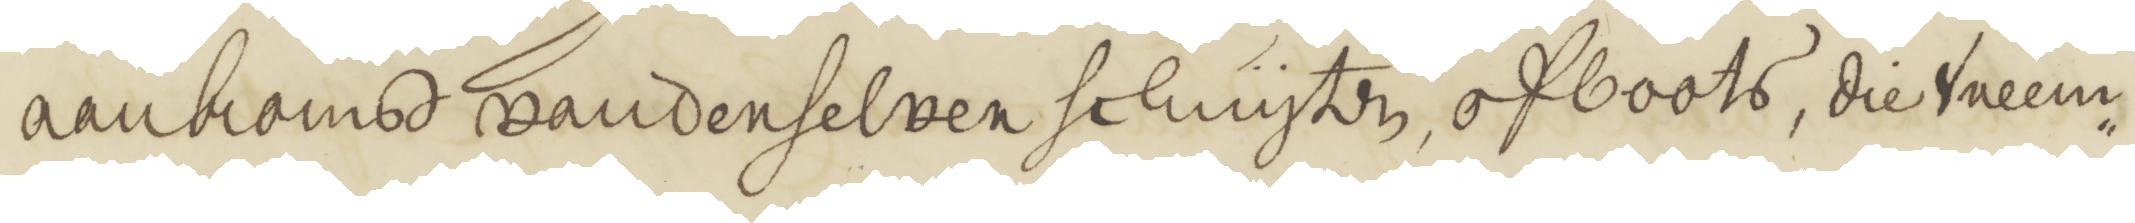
aankomst van derselver schuijten, of boots, die vreem„
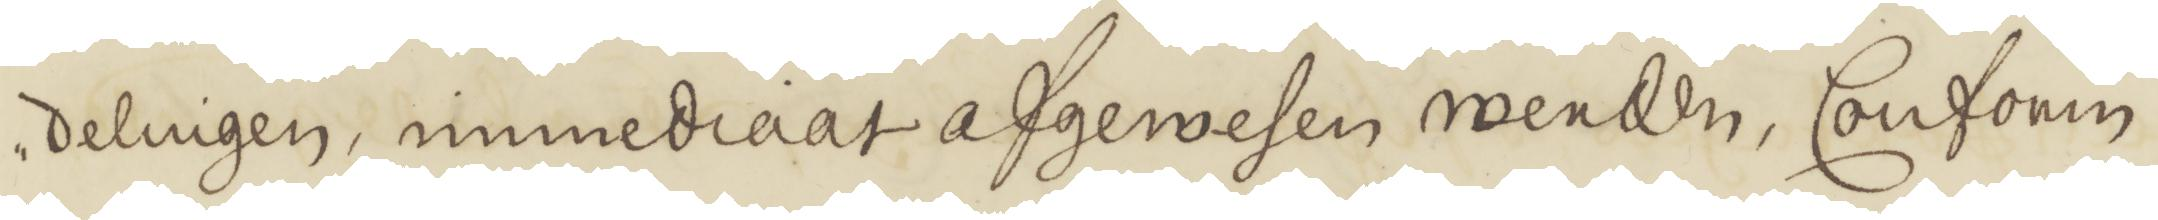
„delingen, immediaat afgewesen werden, Conform
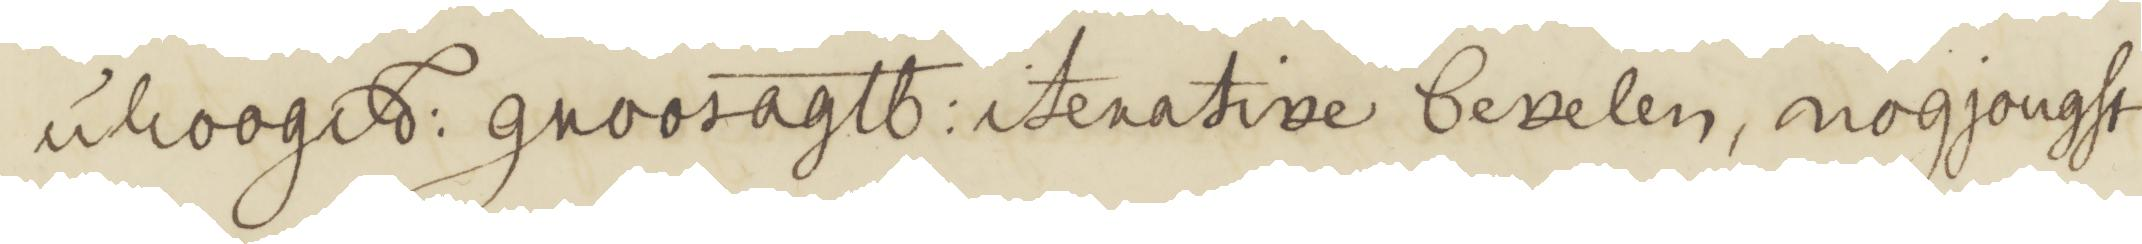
u hoog Ed: groot agtb: iterative bevelen, nog jongst
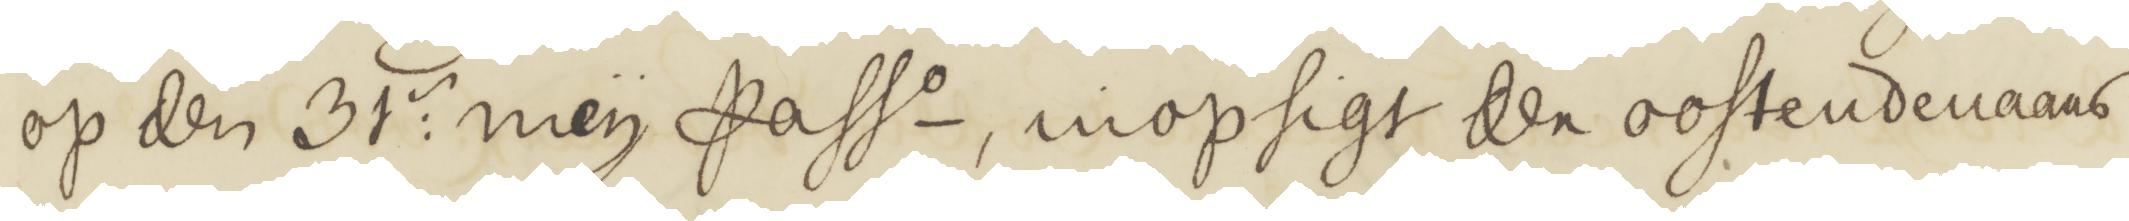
op den 31:' meij pass-o, in op sigt der oostendenaars
